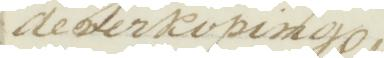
de verkoping
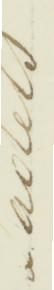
Zadels
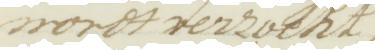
wordt verzocht
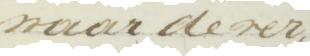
waar de ver„
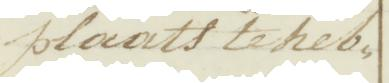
plaats te heb„
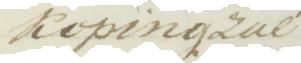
koping zal
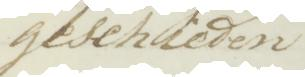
geschieden
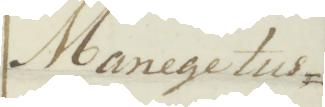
Manege tus=
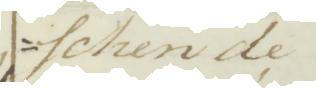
=schen de
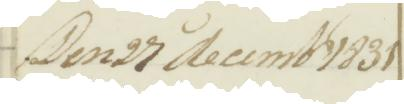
Den 27' decemb 1831
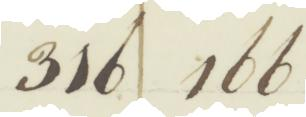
316 166
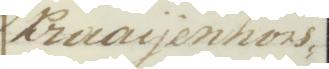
Kraaijenhors„
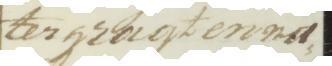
ter gragt en na„
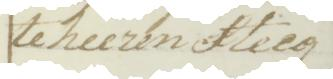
te heeren steeg
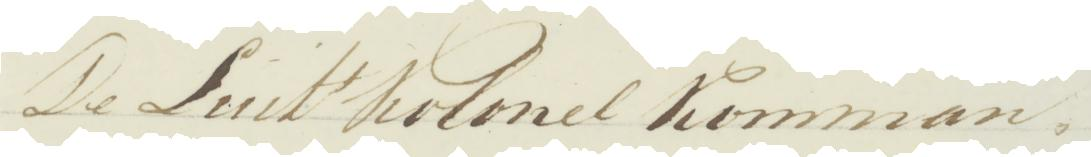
De Luitt Kolonel Komman„
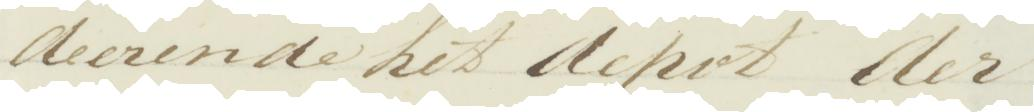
deerende het depot der
